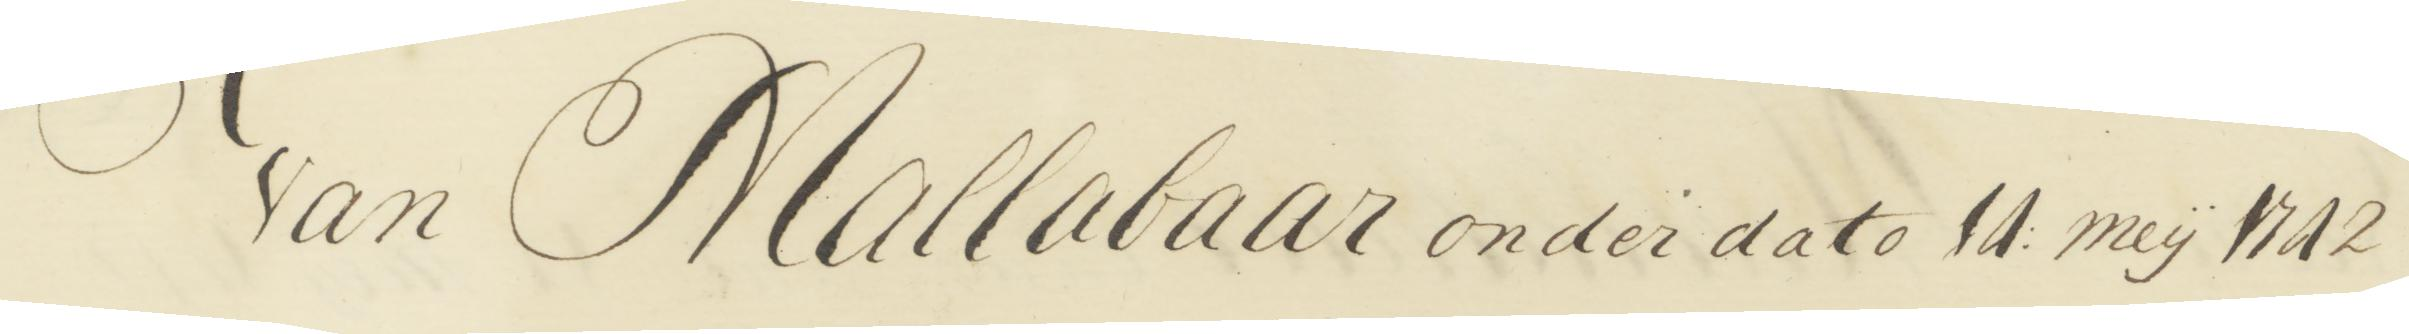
Van Mallabaar onder dato 14: meij 1742
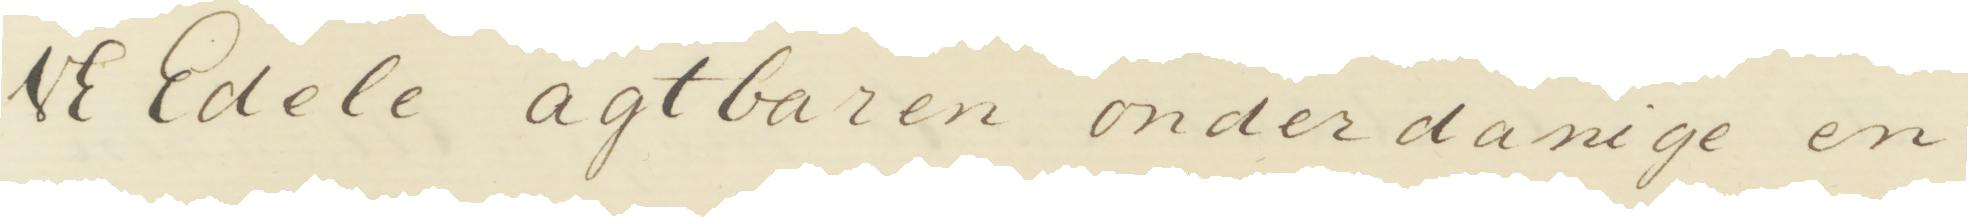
VE Edele agtbaren onder danige en
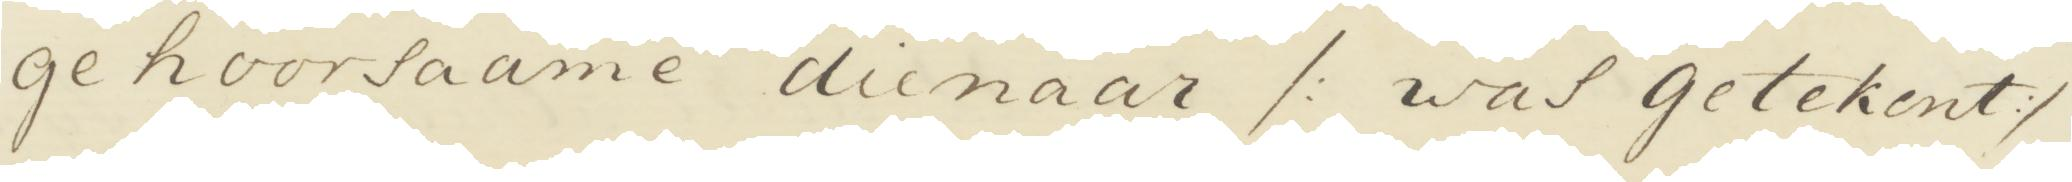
gehoorsaame dienaar /: was getekent:/
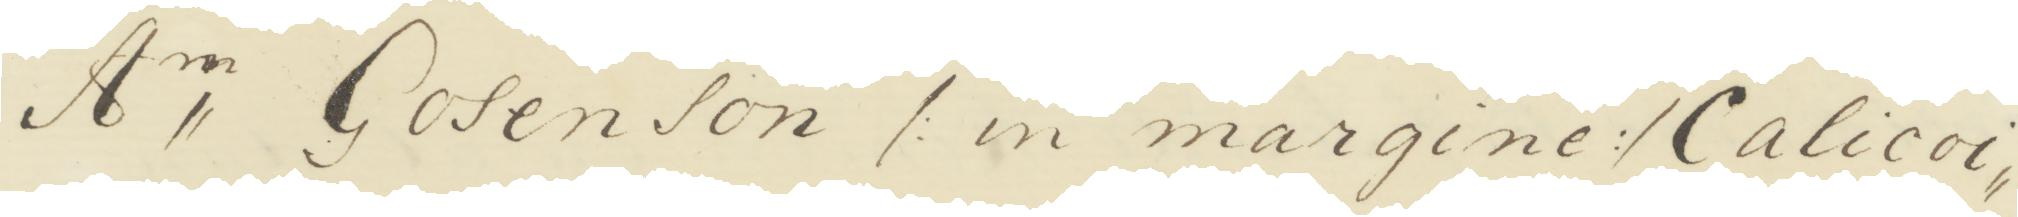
A„m Gosenson /:in margine:/ Calicoi„
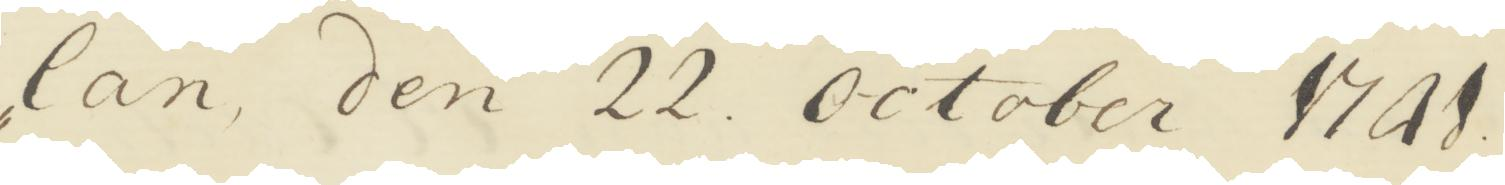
„lan, den 22. October 1741.
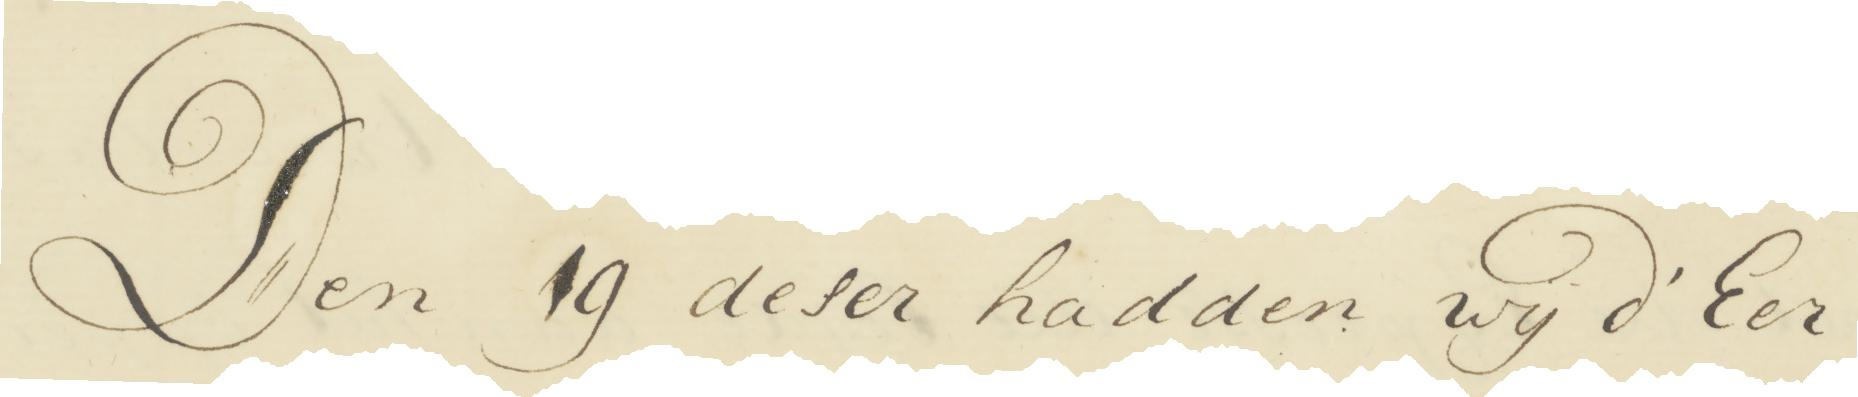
Den 19 deser hadden wij d’Eer
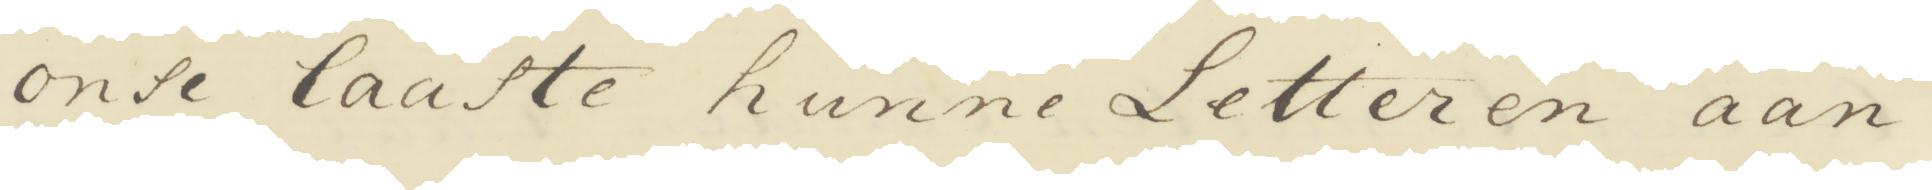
onse laaste hunne Letteren aan
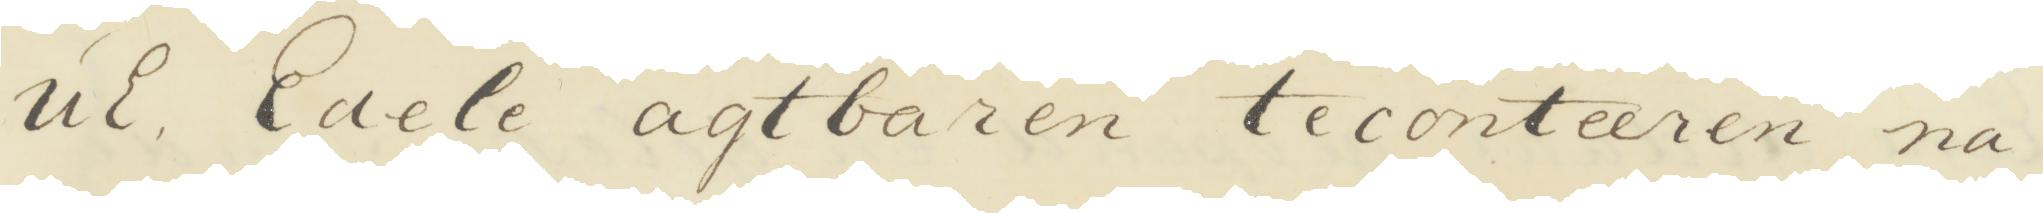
uE. Edele agtbaren te conteeren na
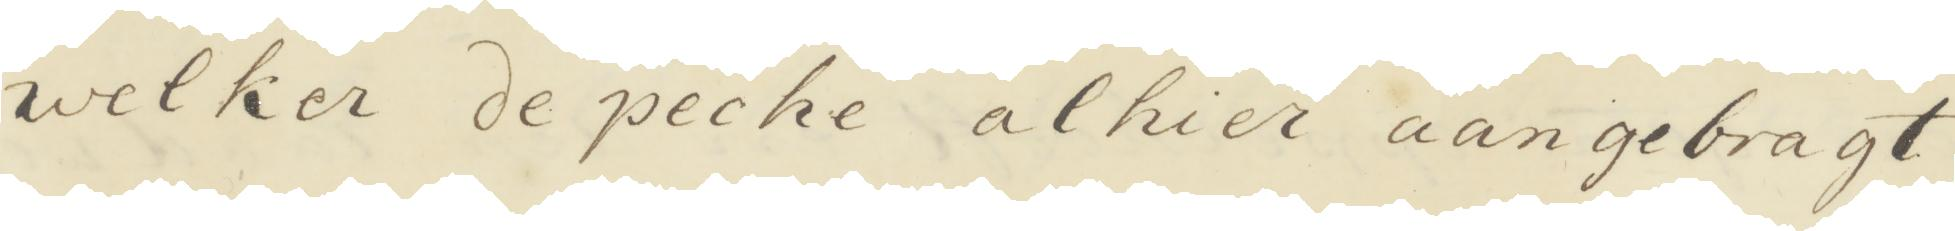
welker de peche alhier aangebragt
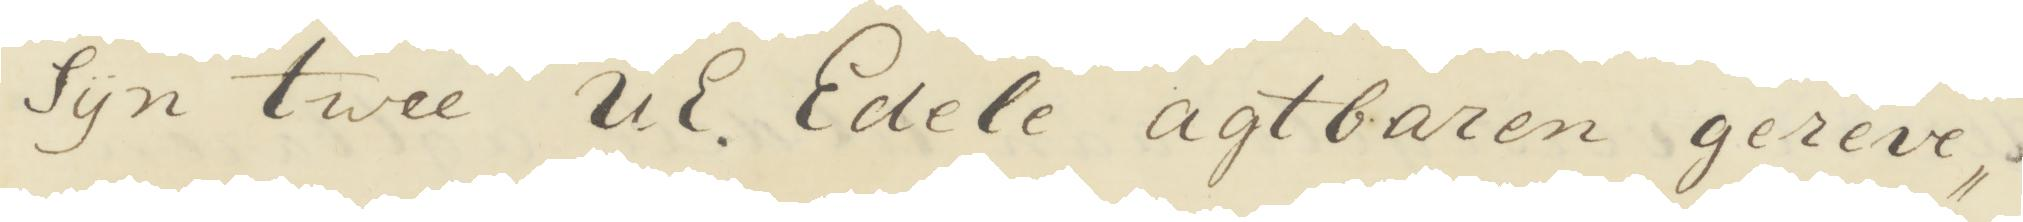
sijn twee uE. Edele agtbaren gereve„
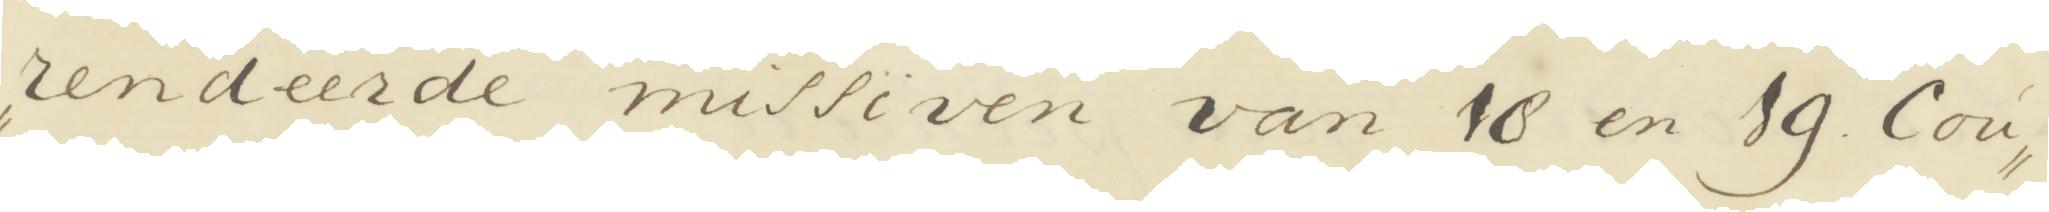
„rendeerde missiven van 18 en 19. Cou„
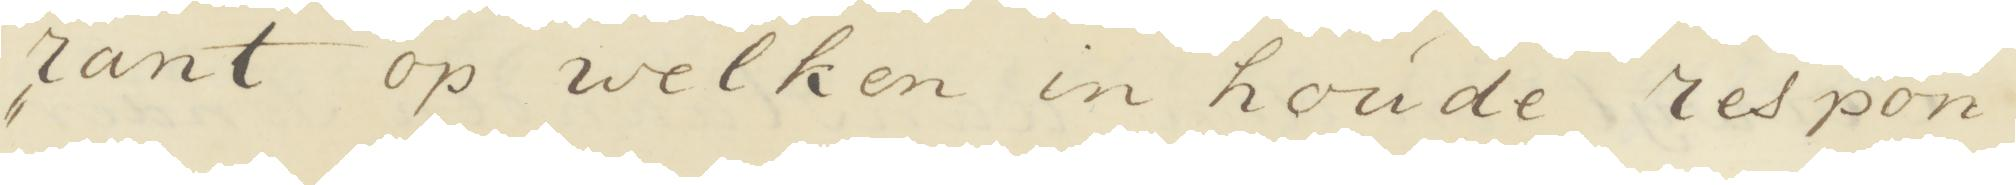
„rant op welken in houde respon
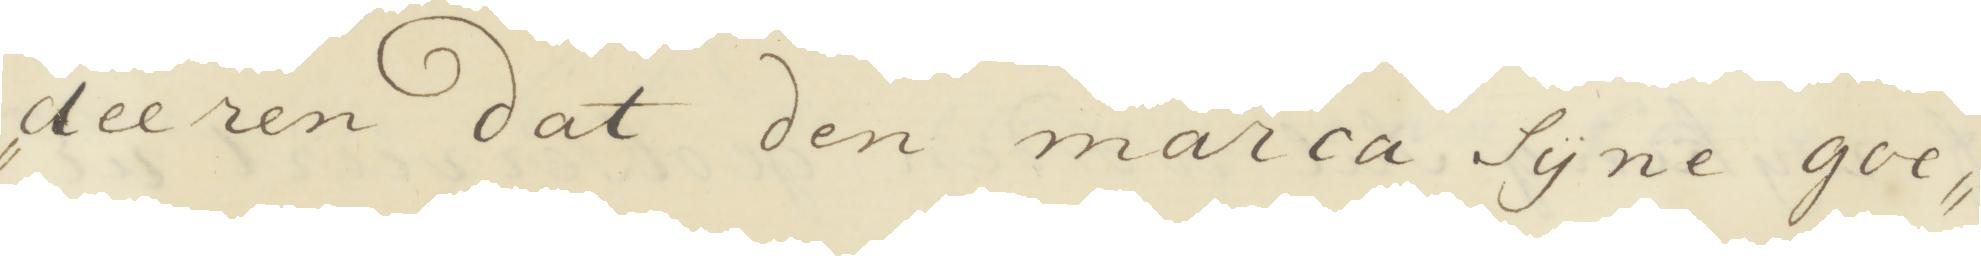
„deeren dat den marca sijne goe„
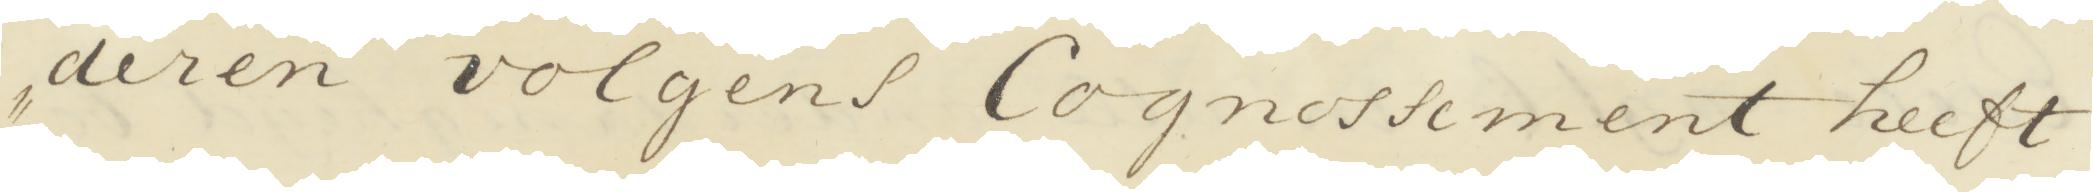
„deren volgens Cognossement heeft
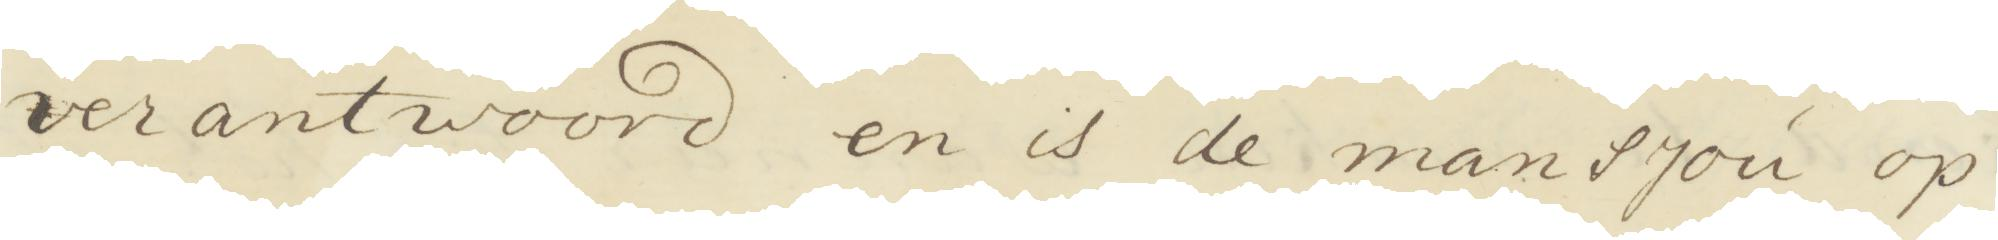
verantwoord en is de mansjou op
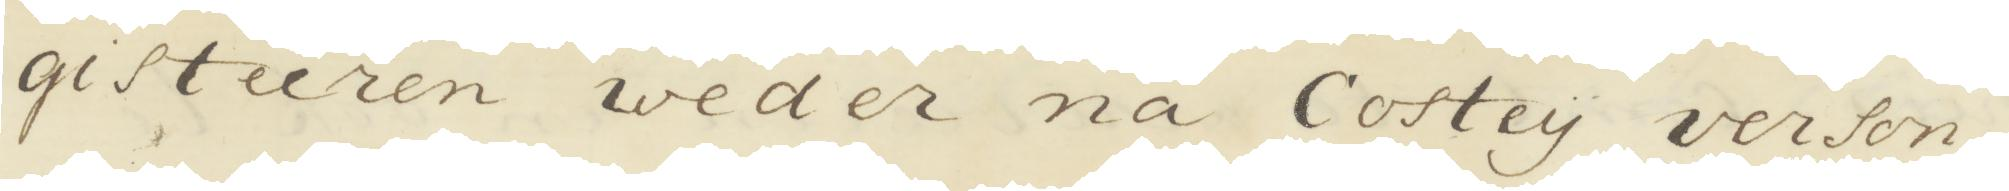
gisteeren weder na Costeij verson
